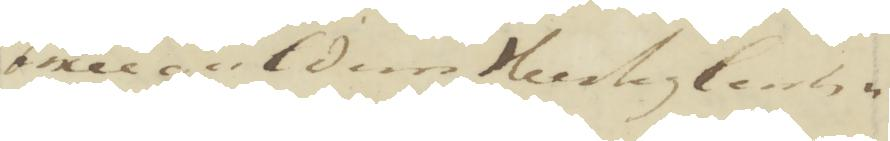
twee guldens Veertig Cents „
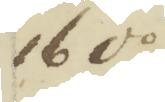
16 do
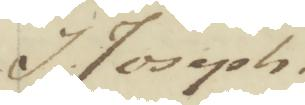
J. Joseph.
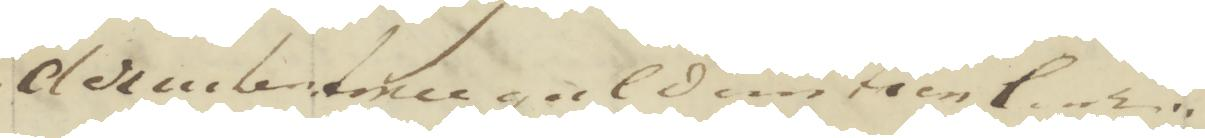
d ruiter . twee guldens tien Cents „
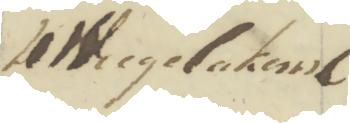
4 Wiegelakens
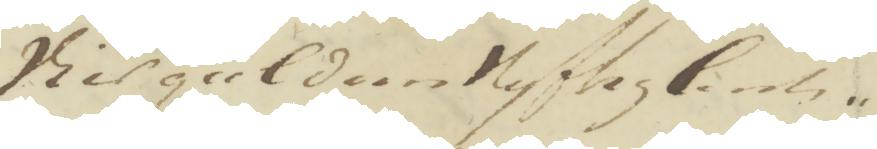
Vier guldens Vyftig Cents „
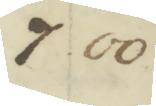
7. 00
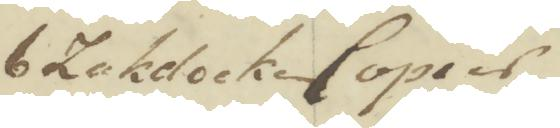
6 zakdoeken Copies
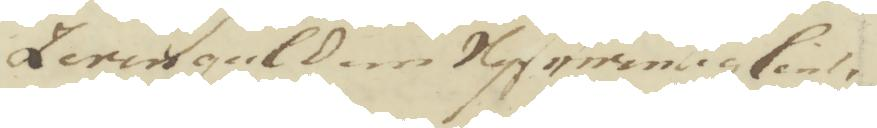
Zeven guldens Vyf en twintig Cents
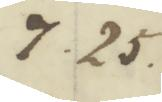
7. 25.
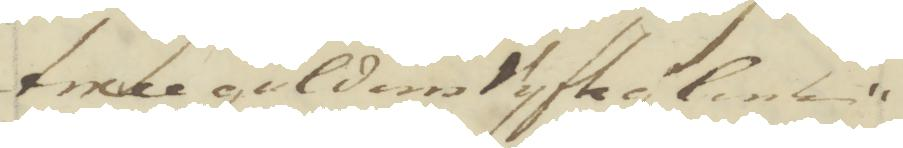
twee guldens Vyftig Cents „
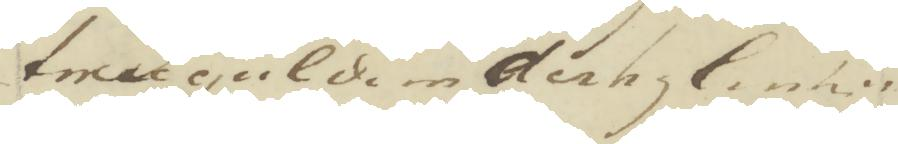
twee guldens dertig Cents
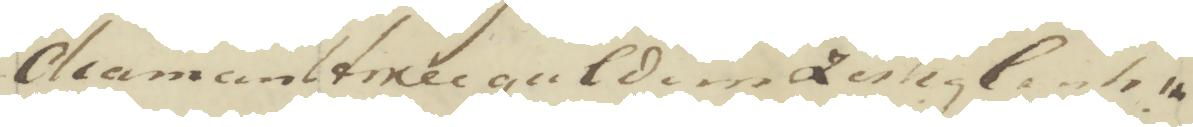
diamant twee guldens zestig Cents „
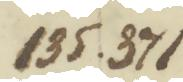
135.371
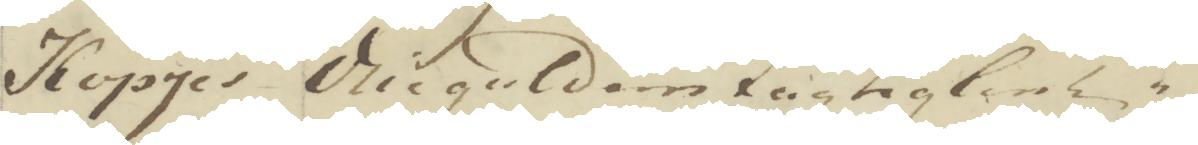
Kopjes drie guldens tagtig Cents „
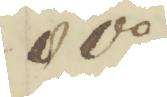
8 do
